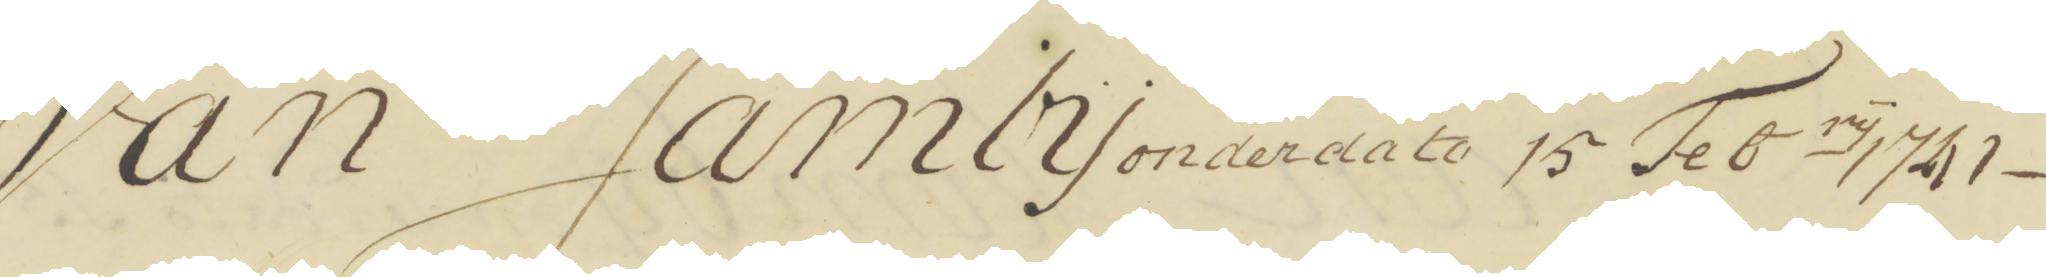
Van Jambij onderdato 15 Febrij 1741–
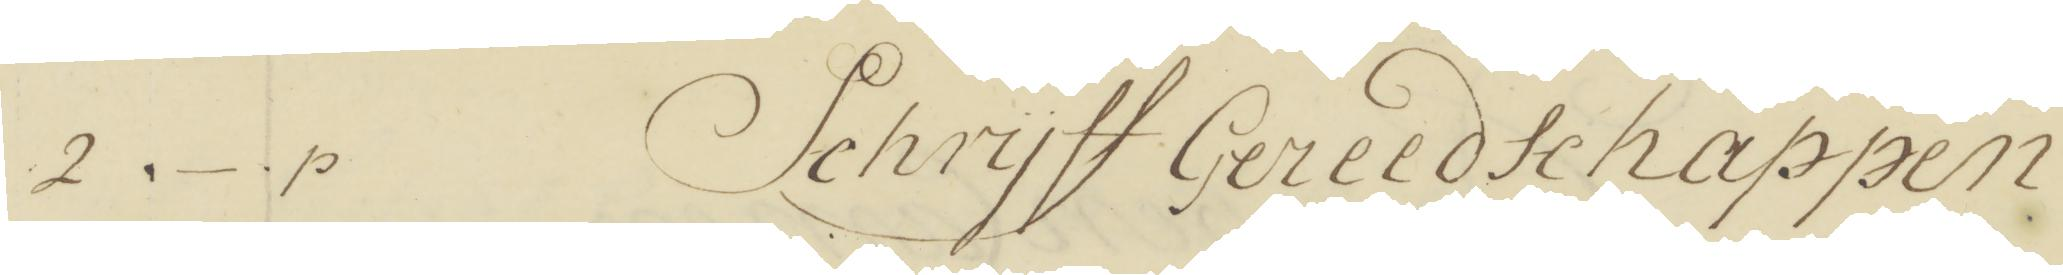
2 .–. p Schrijff Gereedschappen
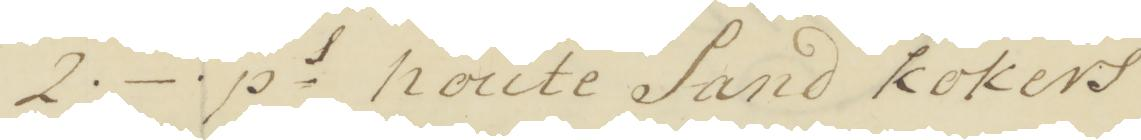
2.–. p=s houte sand kokers
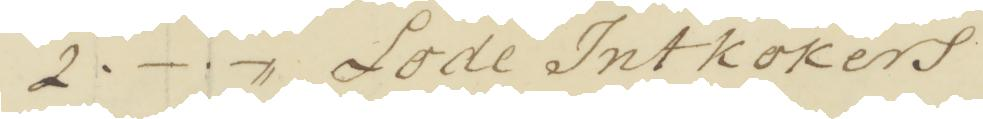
2.–.–„ lode Intkokers
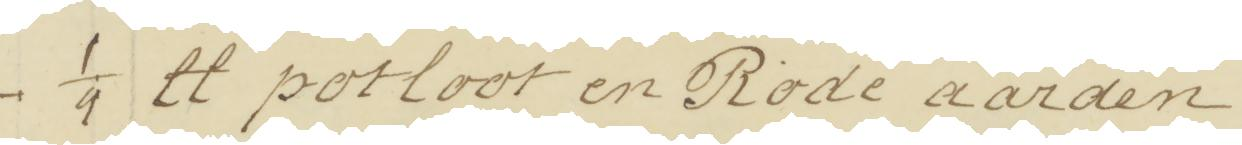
- ¼ lb potloot en Rode aarden
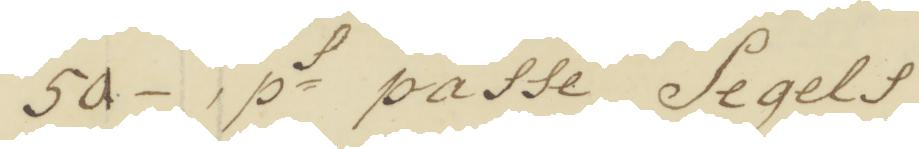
54 – 1 p=s passe segels
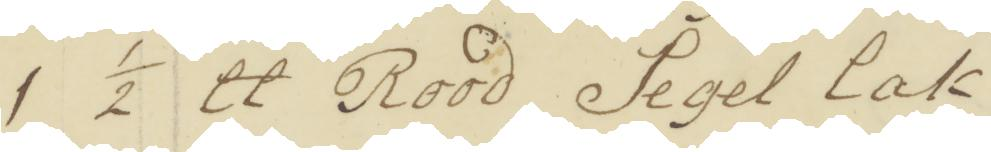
1 ½ lb Rood segel lak
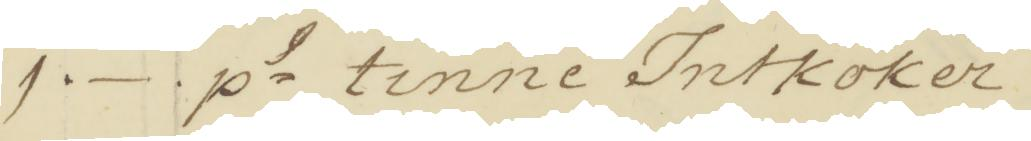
1.–. p=s tinne Intkoker
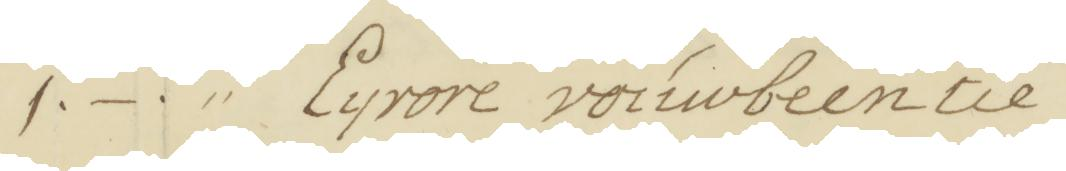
1.–. „ Eyvore vouwbeentie
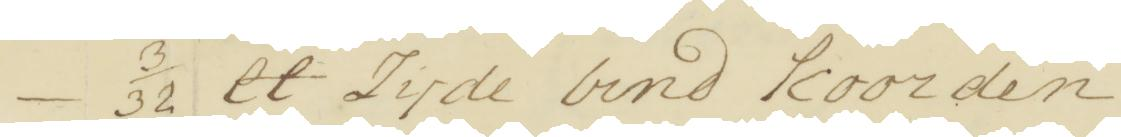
– 3/32 lb zijde bind koorden
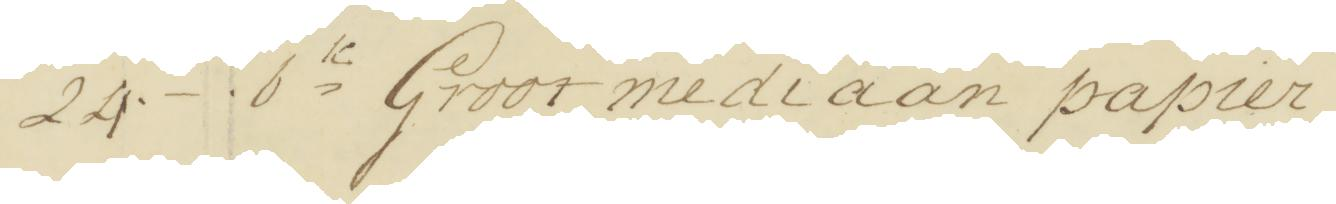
24.–. b=k Groot mediaan papier
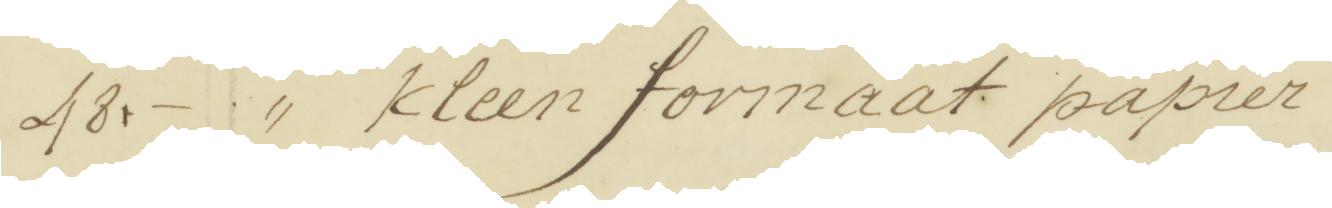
48.–. „ kleen formaat papier
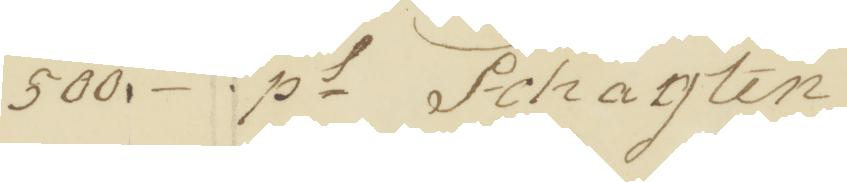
500.–. p=s schagten
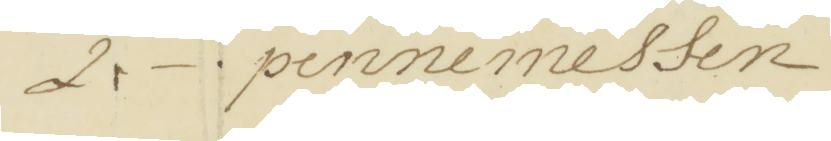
2.–. pennemessen
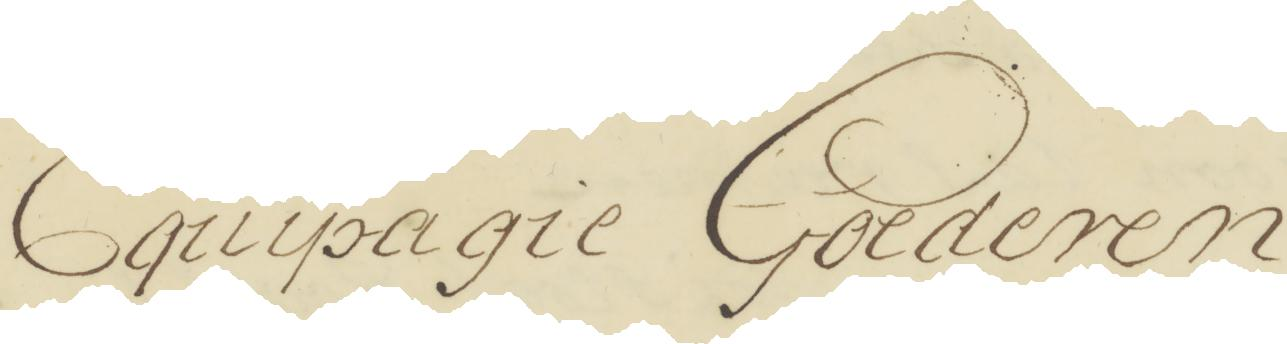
Equipagie Goederen
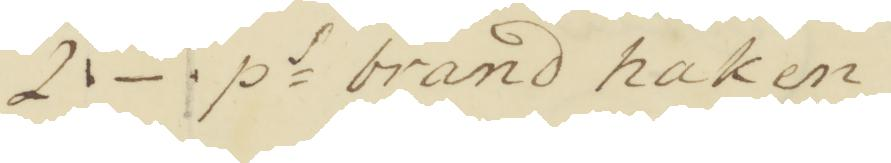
21.–. p=s brand haken
